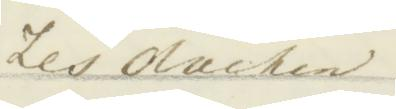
Zes doeken
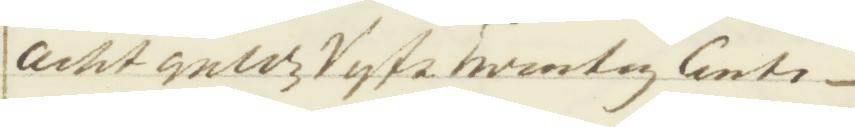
acht gulden Vyf & twintig Cents
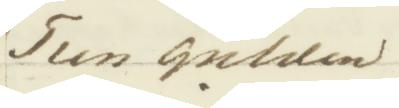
Tien gulden
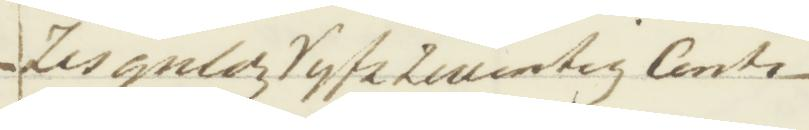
Zes gulden Vyf & Zeventig Cents
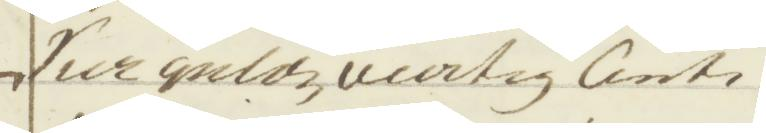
Vier gulden veertig Cents
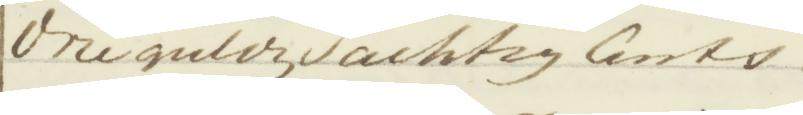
Drie gulden Tachtig Cents
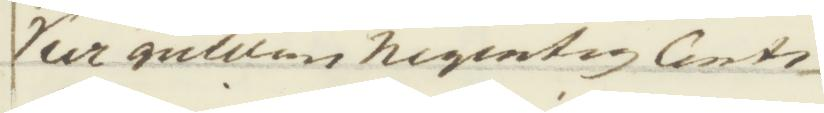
Vier guldens negentig Cents
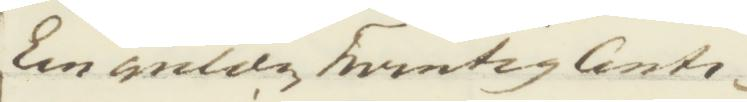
Een gulden Twintig Cents
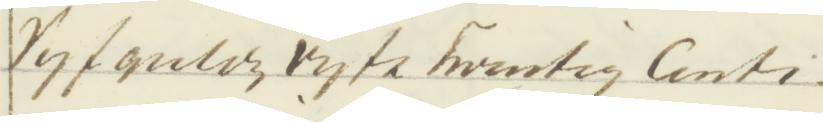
Vyf gulden vyf & Twintig Cents
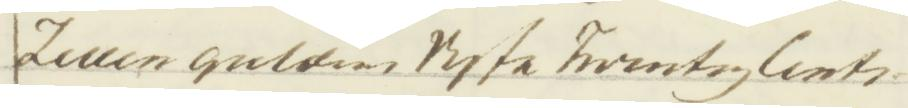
Zeven guldens Vyf & Twintig Cents
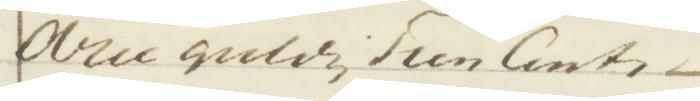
drie gulden Tien Cents
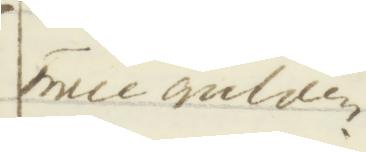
Twee gulden
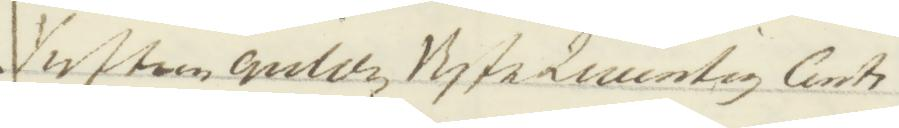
Vyftien gulden Vyf & Zeventig Cents
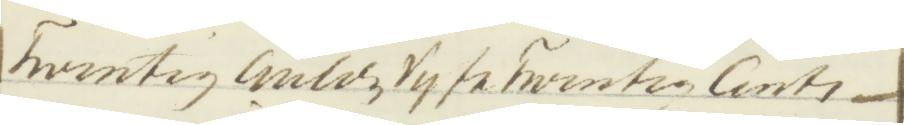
Twintig Gulden Vyf & Twintig Cents
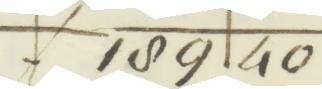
ƒ 189 40
